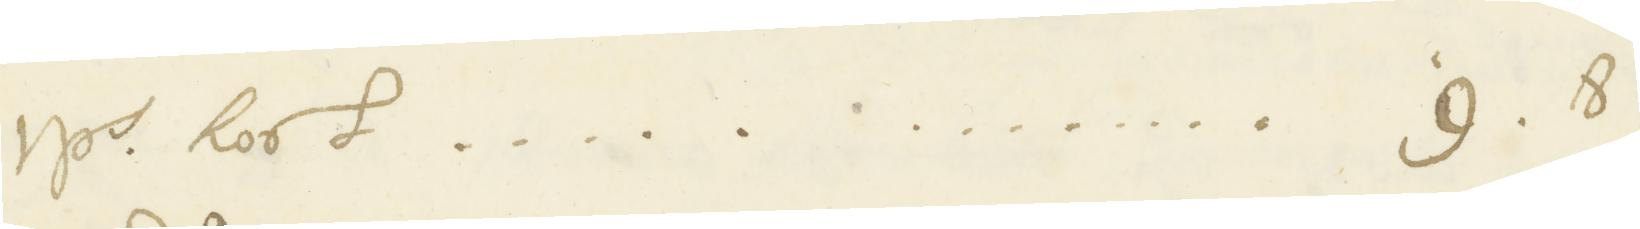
1 p.s kost - - - - - - - - - - - - - - 9 . 8
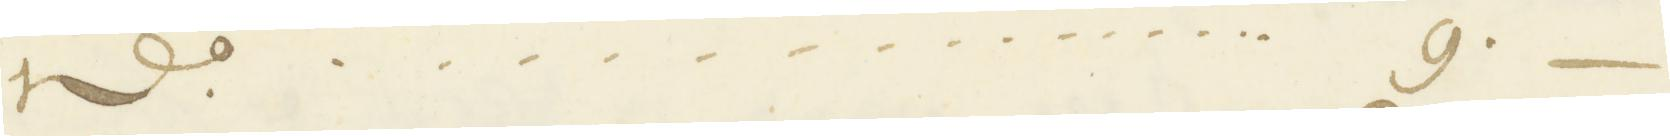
1 d.o - - - - - - - - - - - - 9. —
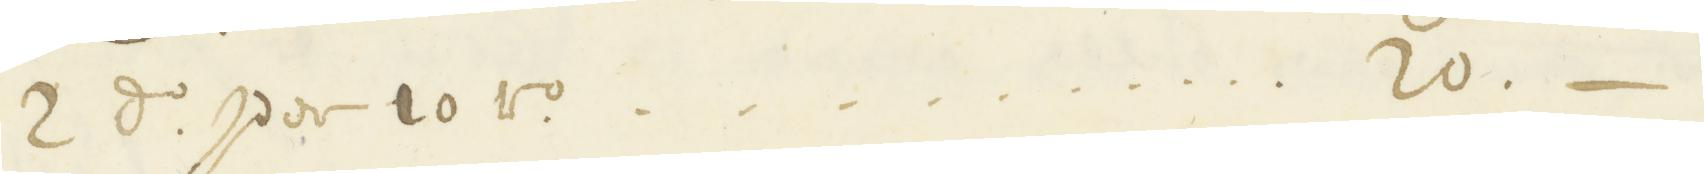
2 d.o per 10 r:o- - - - - - - - - - - 20. —
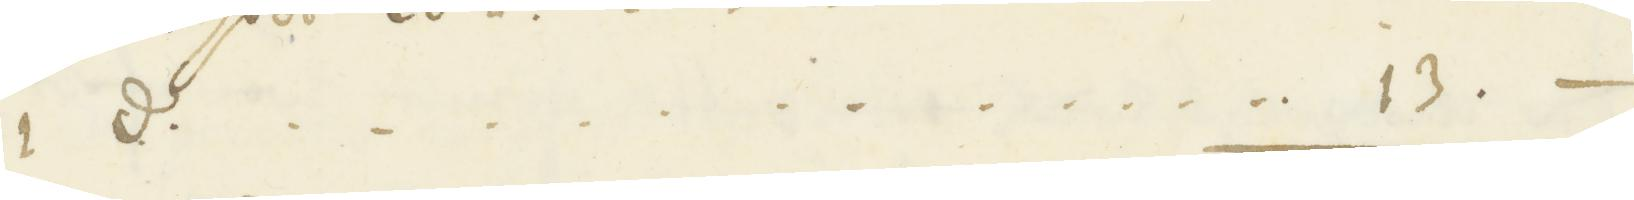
1 d.o - - - - - - - - - - - - - 13. —
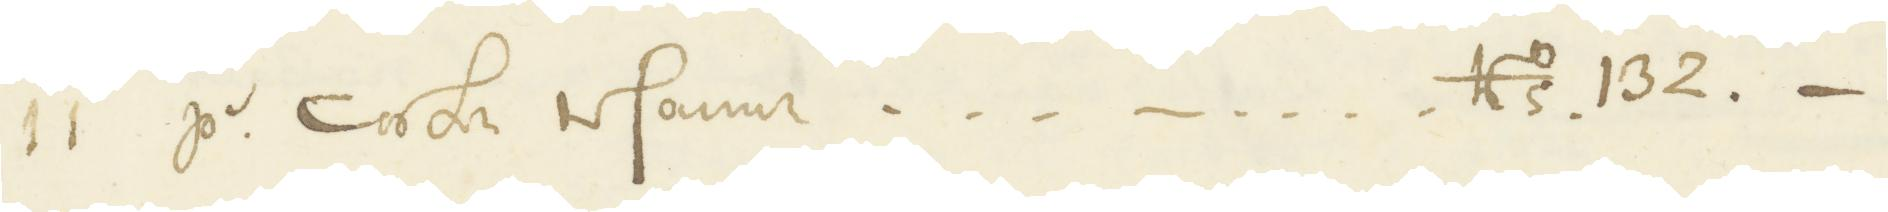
11 p.s Costen te samen - - - - - - - - rs.o 132. —
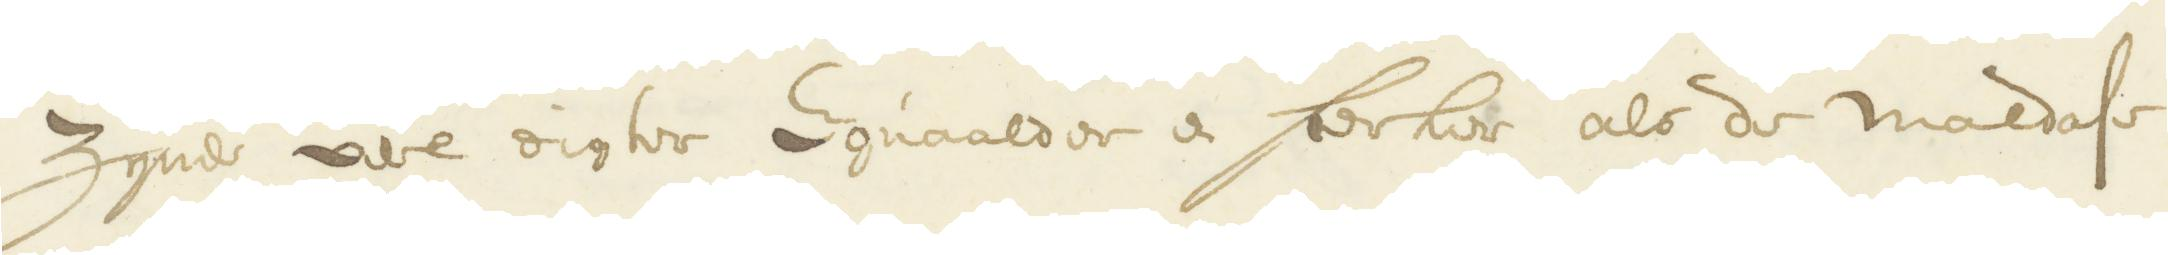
Zijnde veel digter Eguaalder en sterker als de maldase
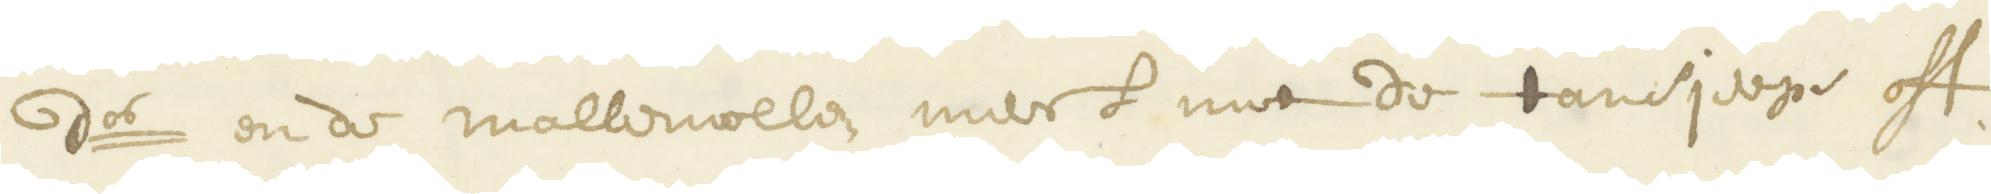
d=os en de mallemollen meest met de tansjeepe off
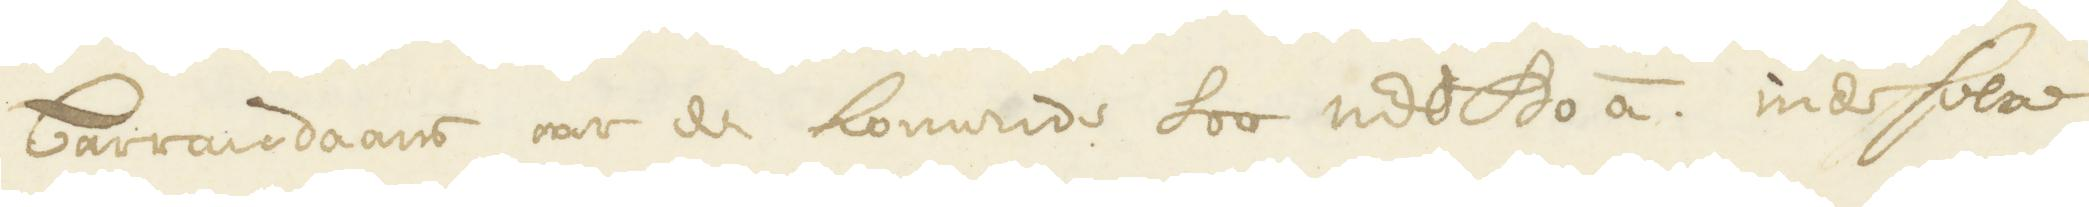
barrandaans var de komende soo uEd Ho a. in deselve
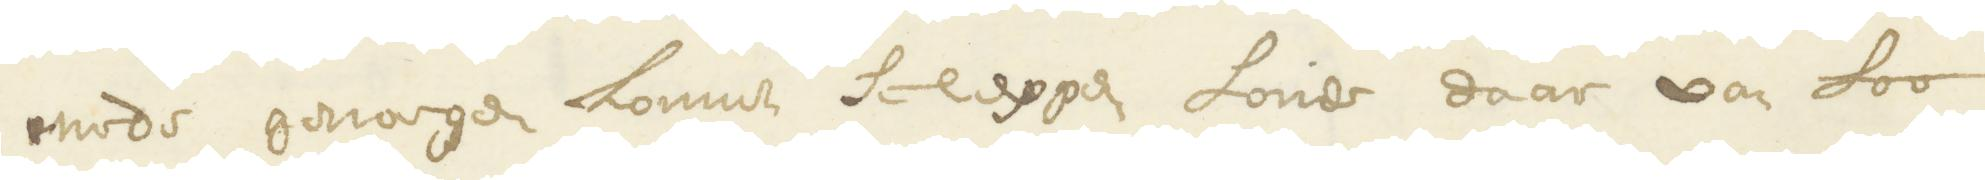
mede genoegen konnen scheppen soude daar van soo
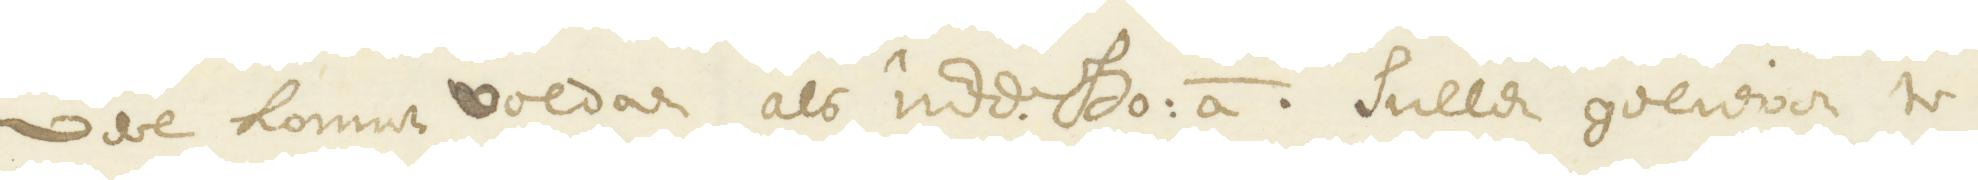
veel konnen voldaen als uEd. Ho: a. sullen gelieven te
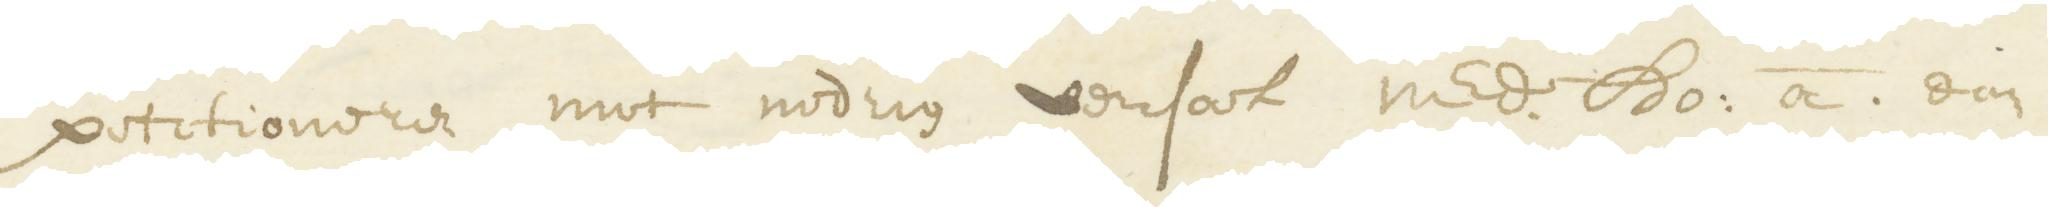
petitioneren met nedrig versoek uEd. Ho: a. dien
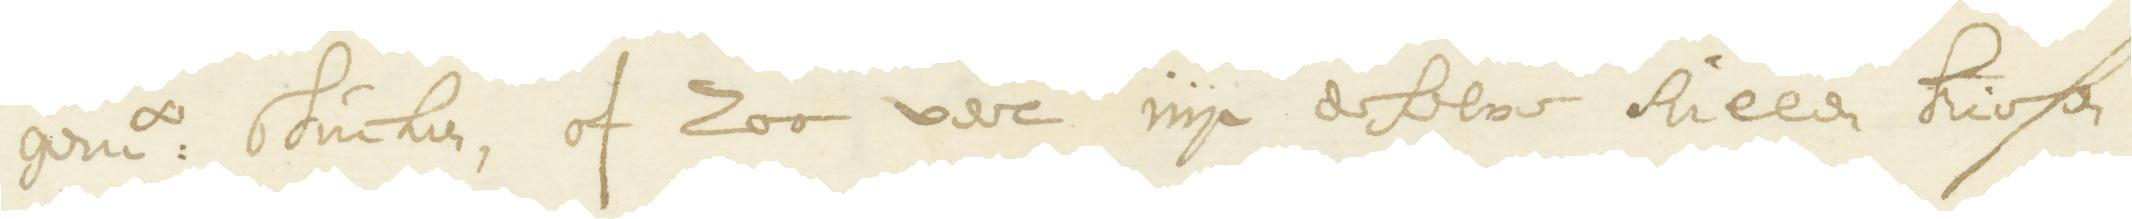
gem: stucken, of zoo veel uijt deselve sullen kiesen
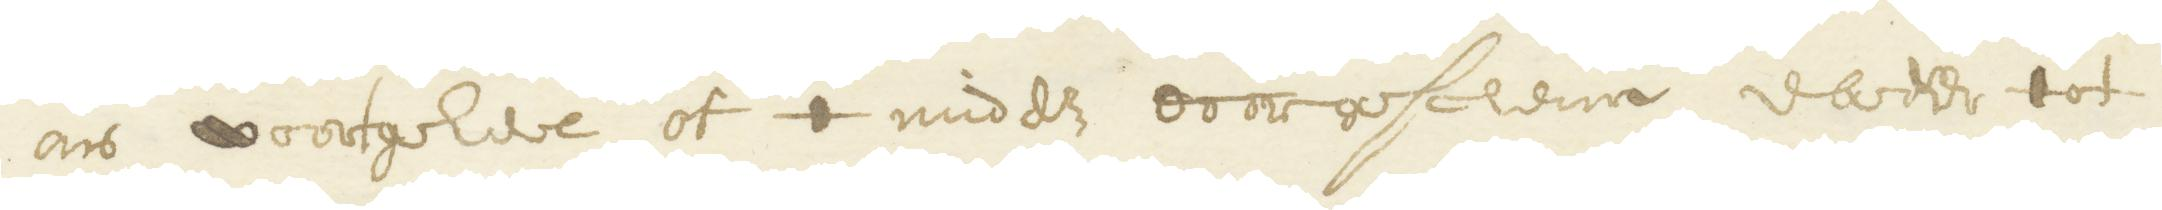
ons voorgeheel of t midden door gescheine werden tot
